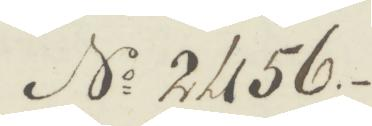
N=o 2456.-
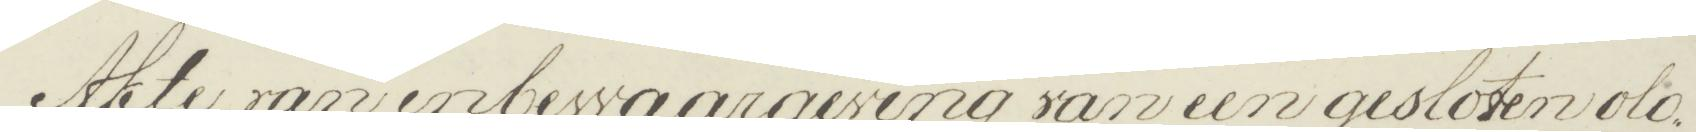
Akte van inbewaargeving van een gesloten olo„
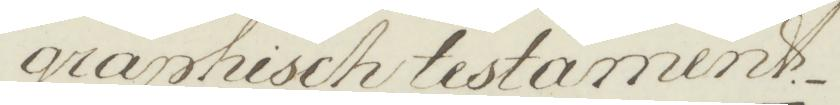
graphisch testament.-
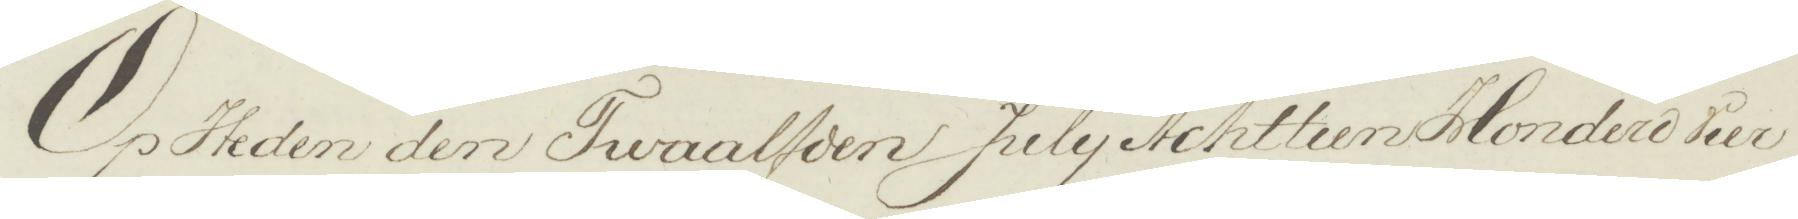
Op Heden den Twaalfden July Achttien Honderd Vier
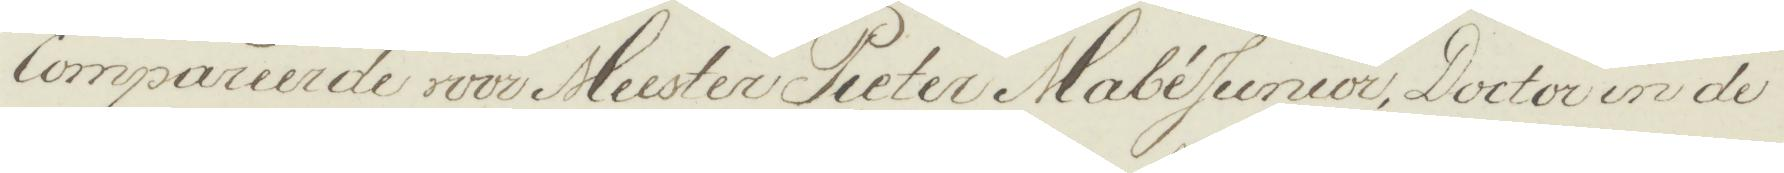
Compareerde voor Meester Pieter Mabé Junior, Doctor in de
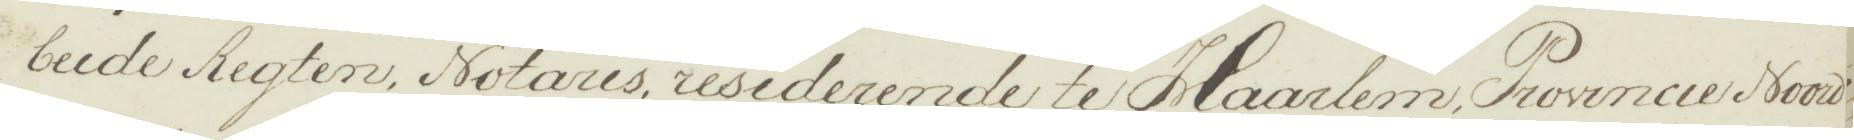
beide Regten, Notaris, residerende te Haarlem, Provincie Noord
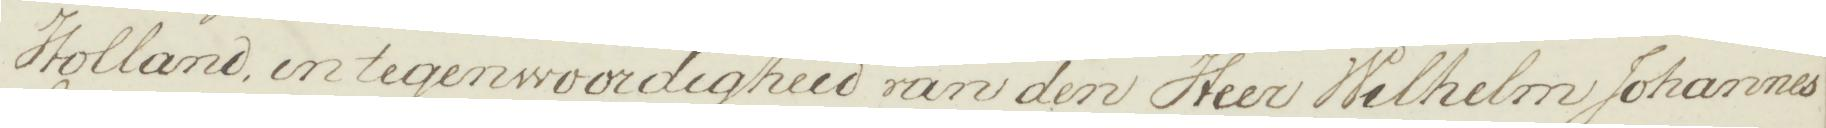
Holland, in tegenwoordigheid van den Heer Wilhelm Johannes
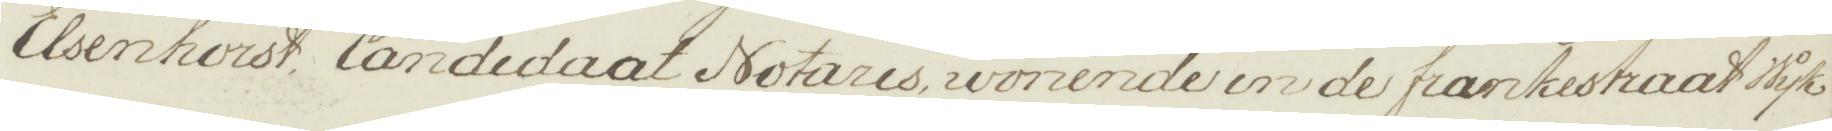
Elsenhorst, Candidaat Notaris, wonende in de frankestraat Wijk
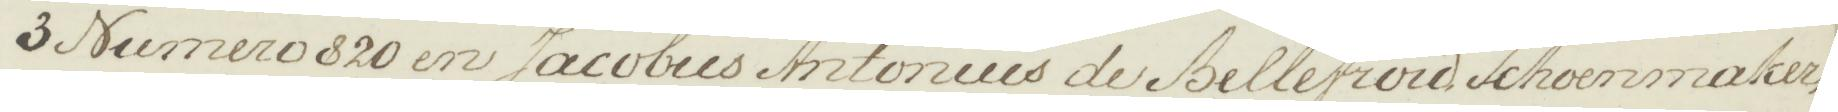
3 Numero 820 en Jacobus Antonius de Bellefroid, Schoenmaker,
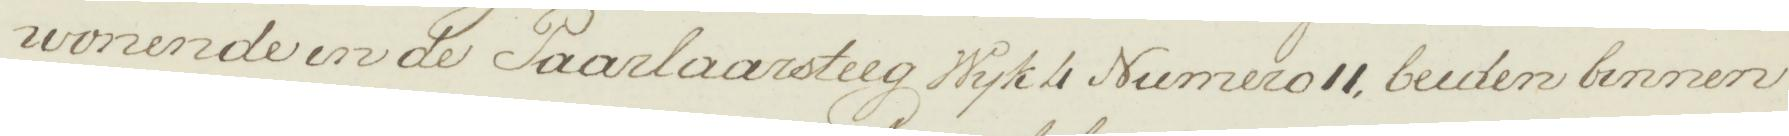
wonende in de Paarlaarsteeg Wyk 4 Numero 11, beiden binnen
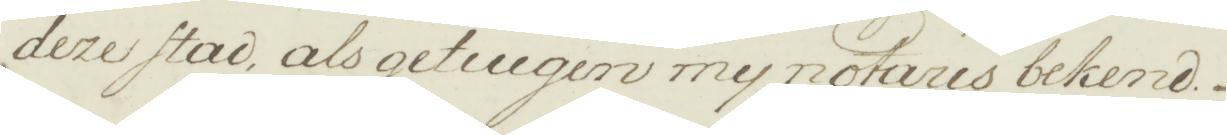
deze stad, als getuigen my notaris bekend.-
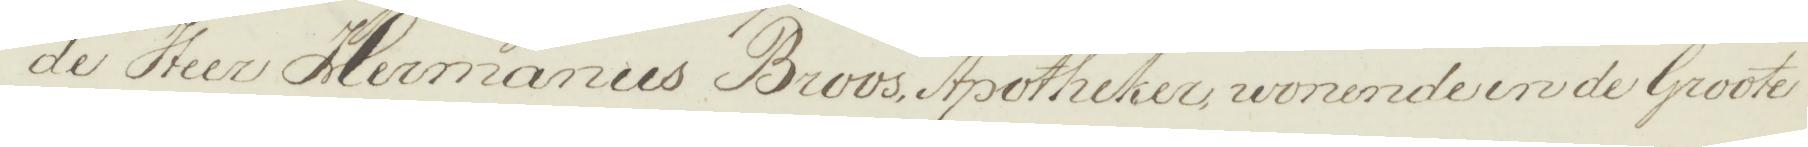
de Heer Hermanus Broos, Apotheker, wonende in de Groote
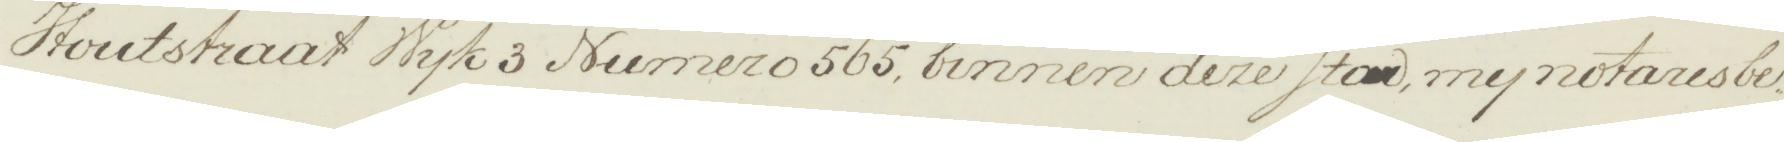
Houtstraat Wyk 3 Numero 565, binnen deze stad, my notaris be
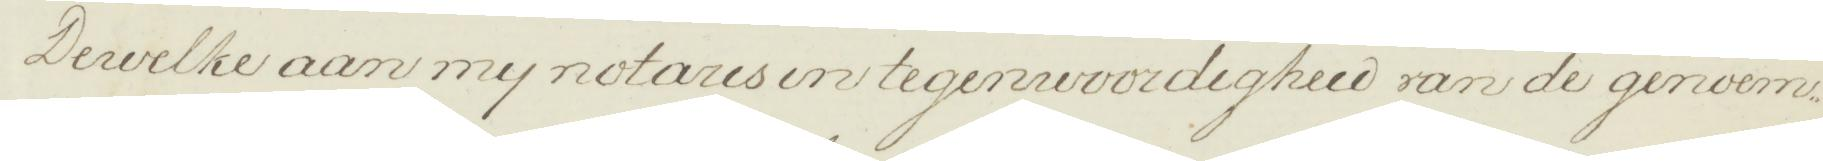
Dewelke aan my notaris in tegenwoordigheid van de genoem
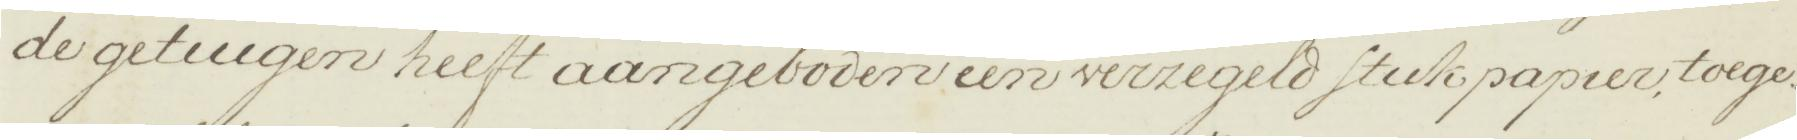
de getuigen heeft aangeboden een verzegeld stuk papier, toege
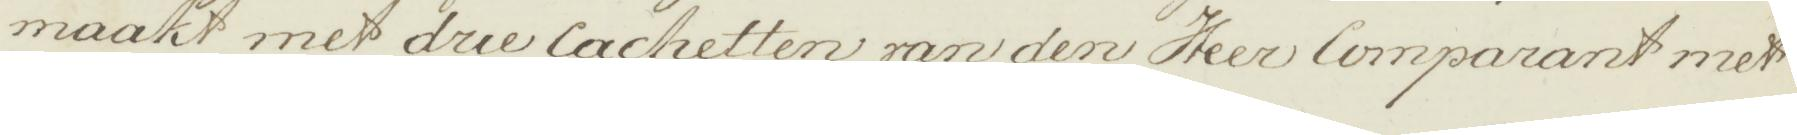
maakt met drie cachetten van den Heer Comparant met
